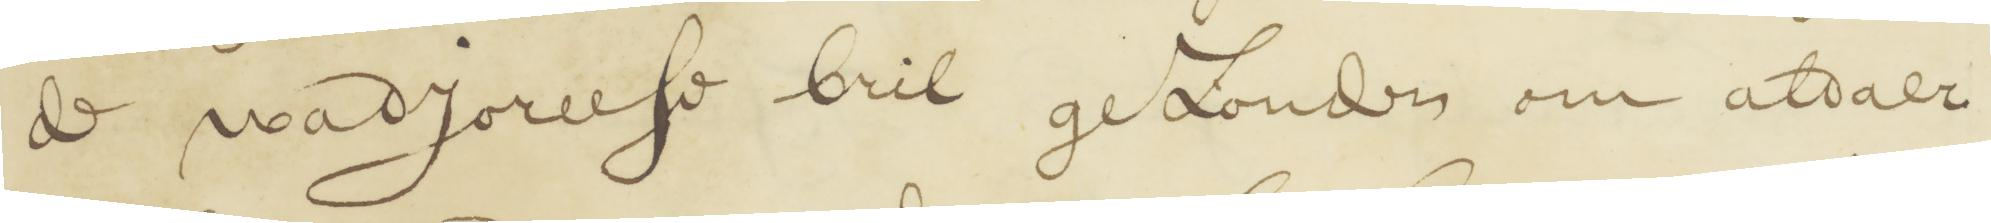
de wadjoreese bril gezonden om aldaer
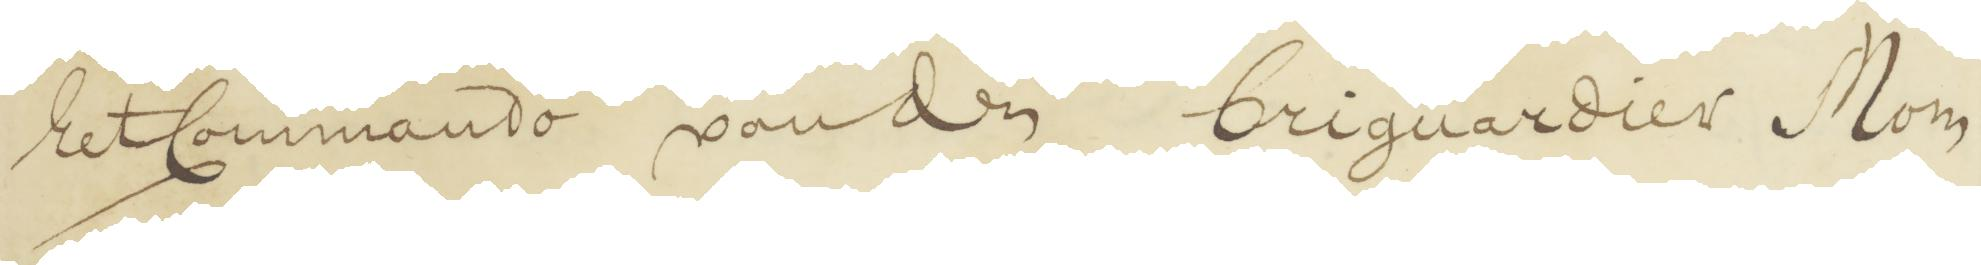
het Commando van den briguardier Mom
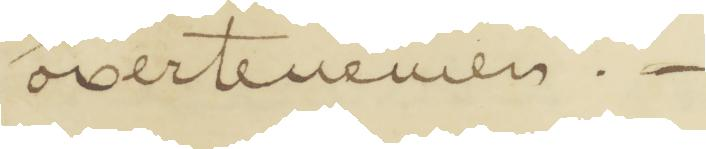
overtenemen. _
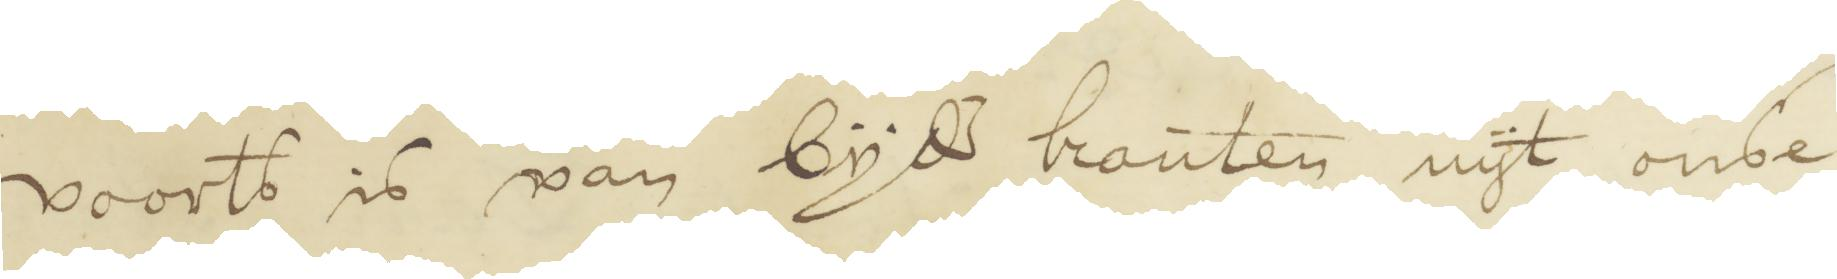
voorts is van bijde kanten uijt onse
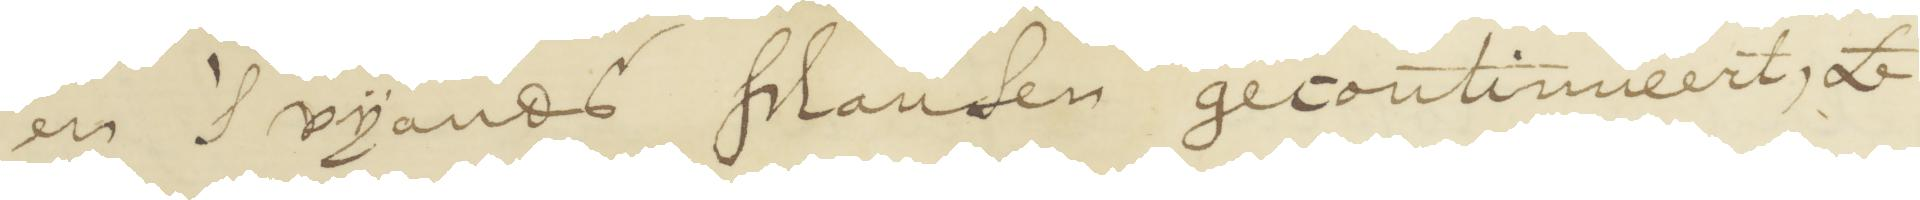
en ’s vijands schansen gecontinueert, te
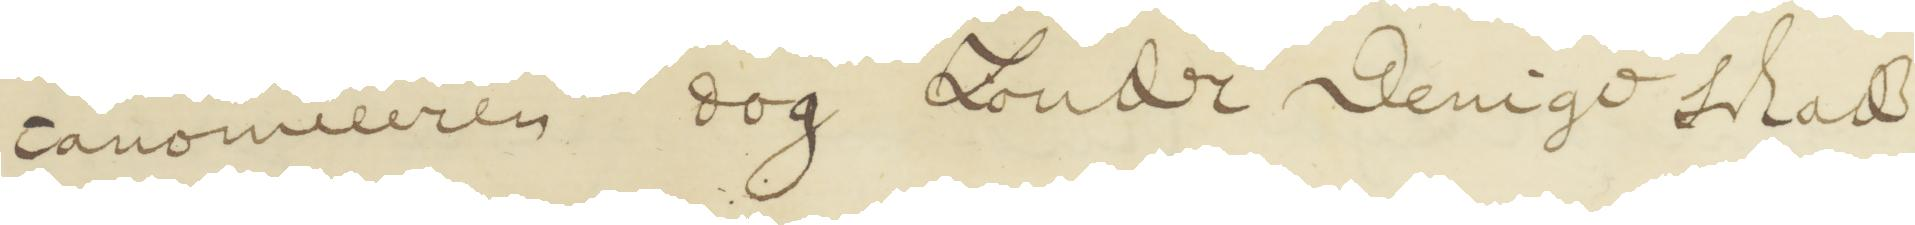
canonneeren dog zonder Eenige schade
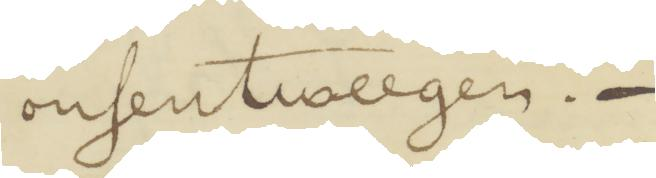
onsentweegen.—
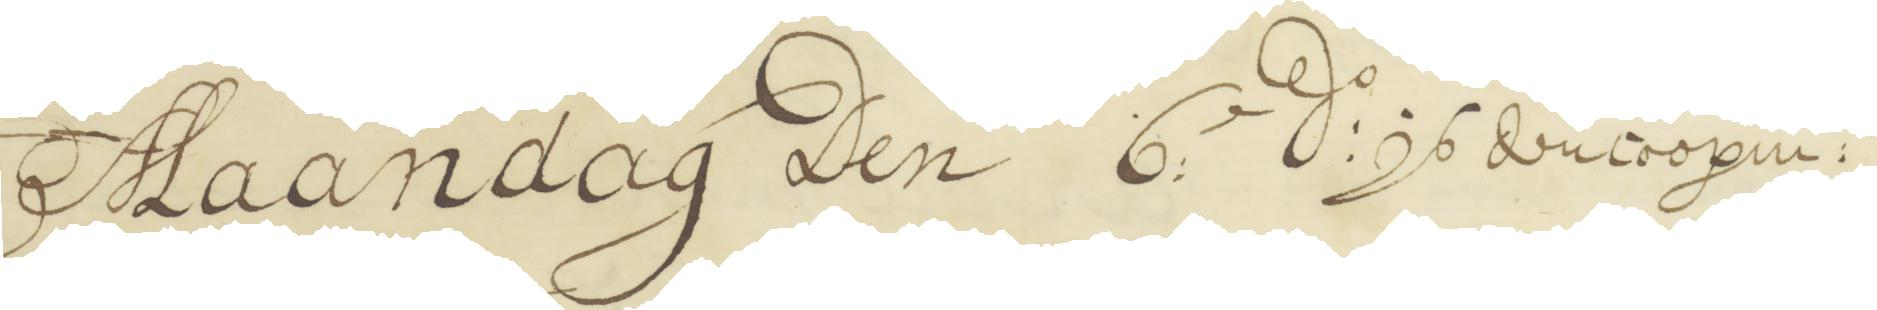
Maandag Den 6:' d:o js den coopm.
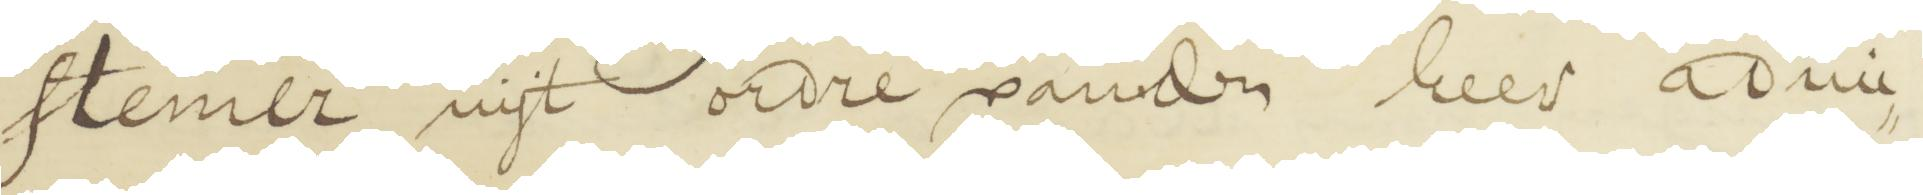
stemer uijt ordre vanden heer admi„
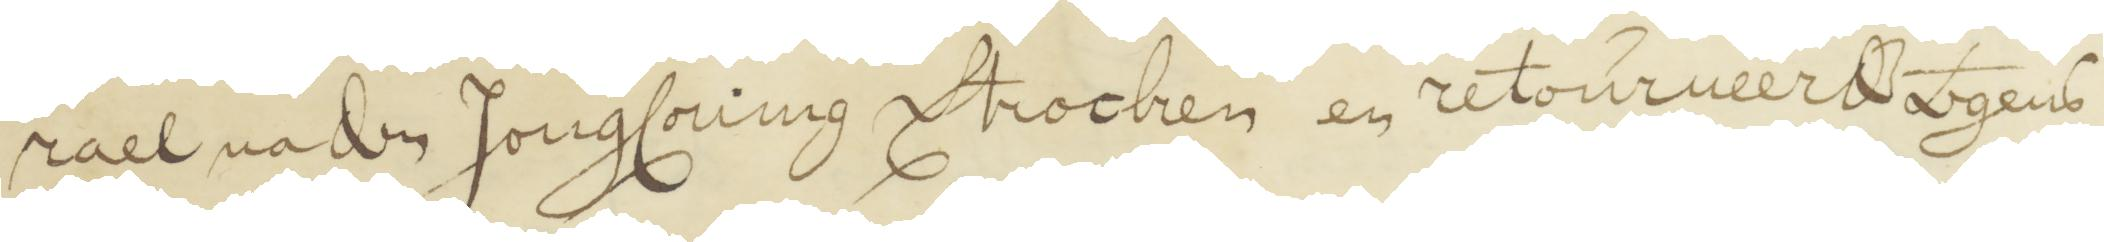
rael na den JongConing vertrocken en retourneerde tegens
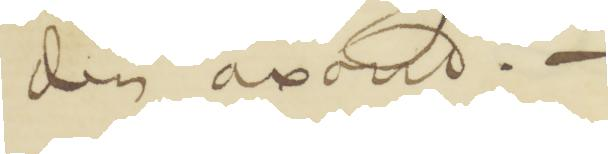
den avond.—
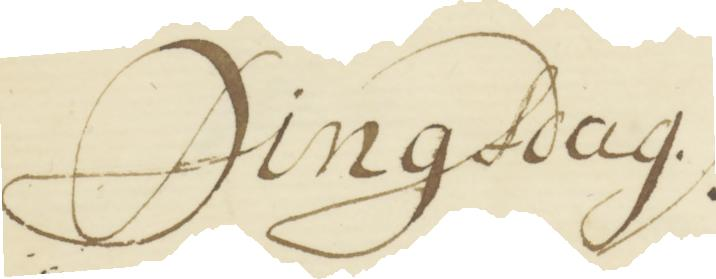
Dingsdag.
